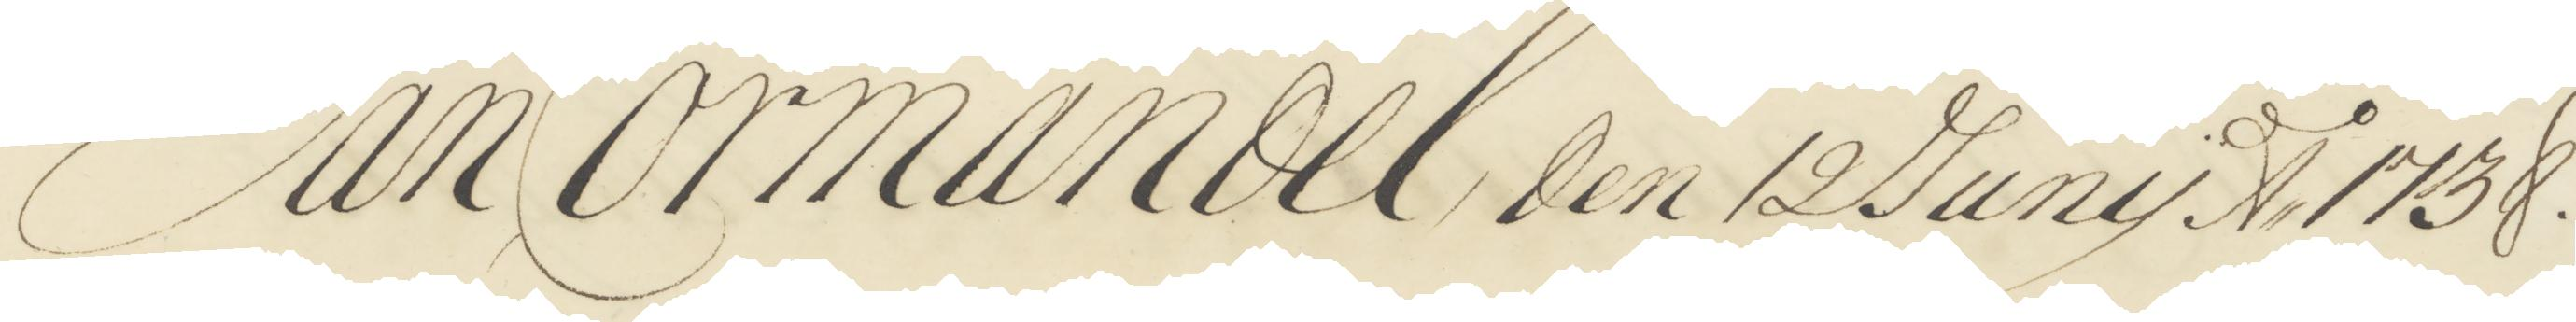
Van Cormandel, den 12 Iunij A„o 1738
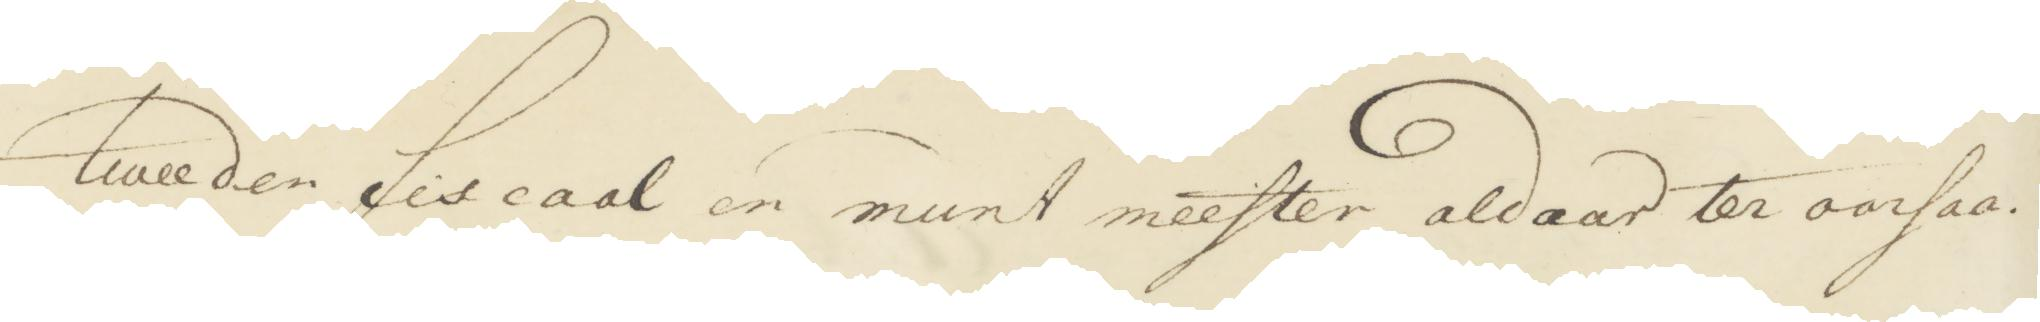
tweeden fiscaal en munt meester aldaar ter oorsaa.
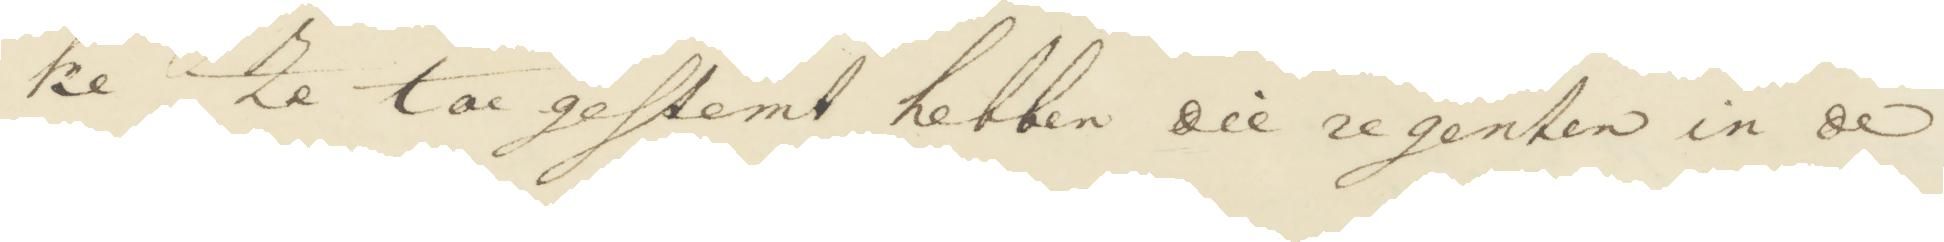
ke ze toe gestemt hebben die regenten in de
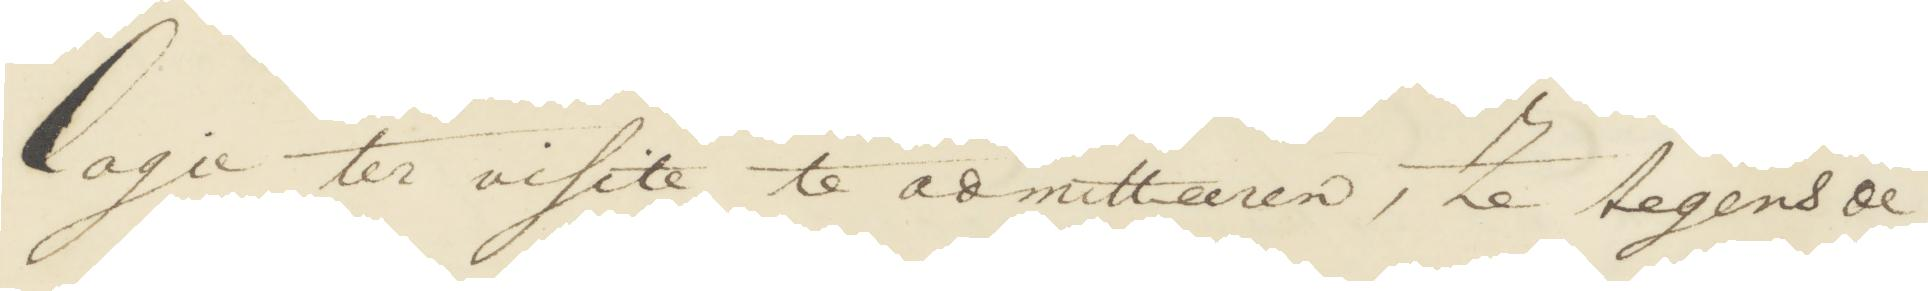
logie ter visite te admitteeren, ze tegens de
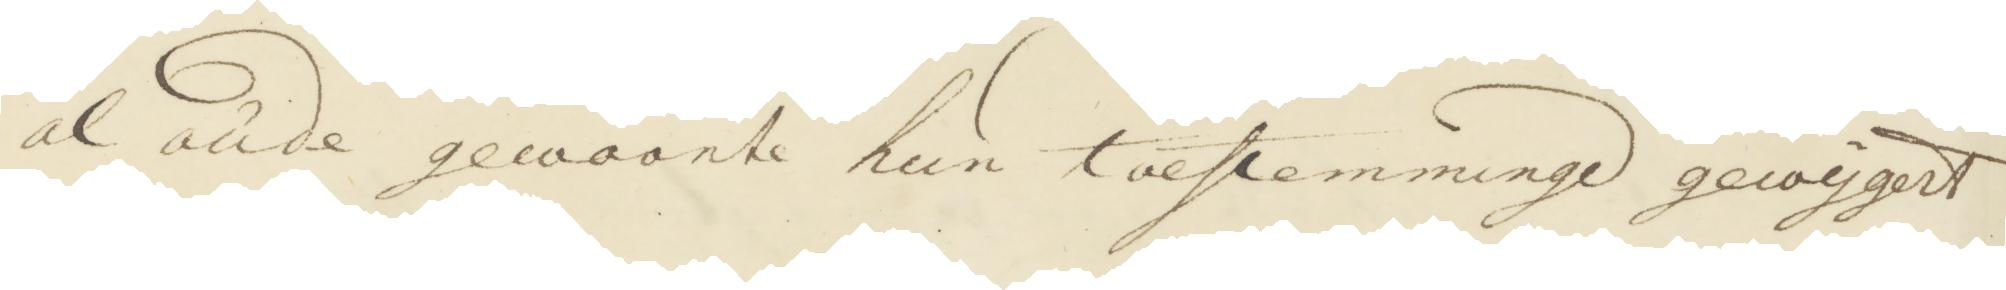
al oude gewoorte hun toestemminge gewijgert
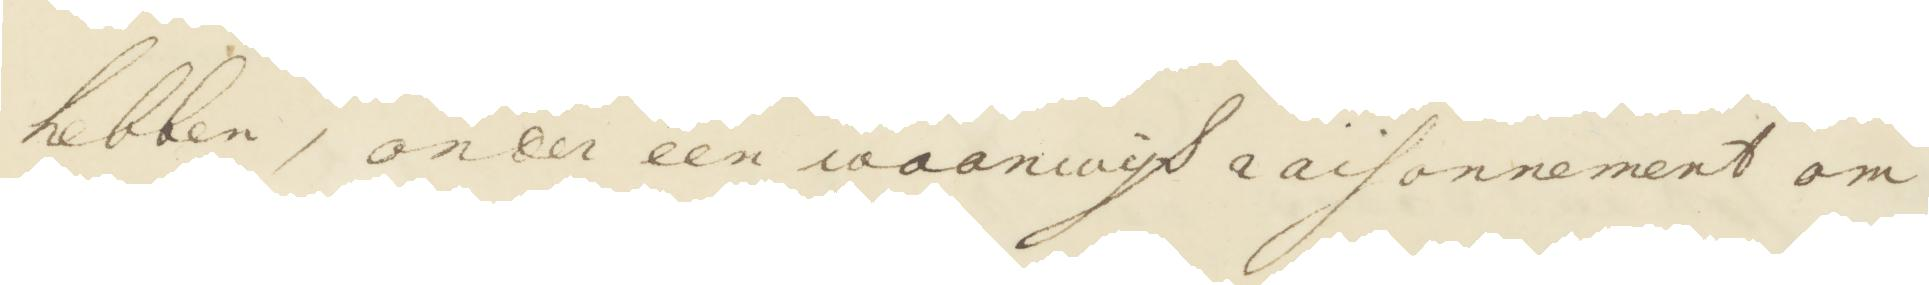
hebben, onder een waanwijs raisonnement om
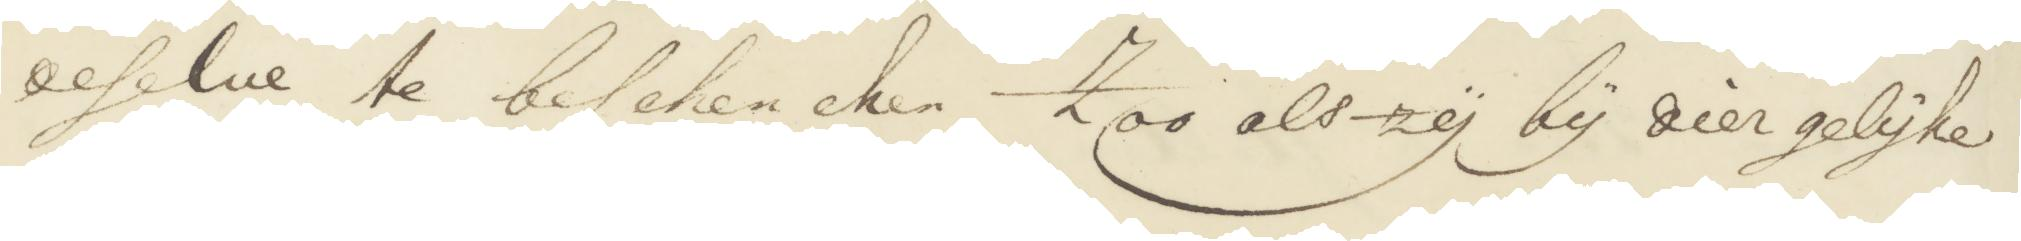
deselve te beschencken zoo als zij bij dier gelijke
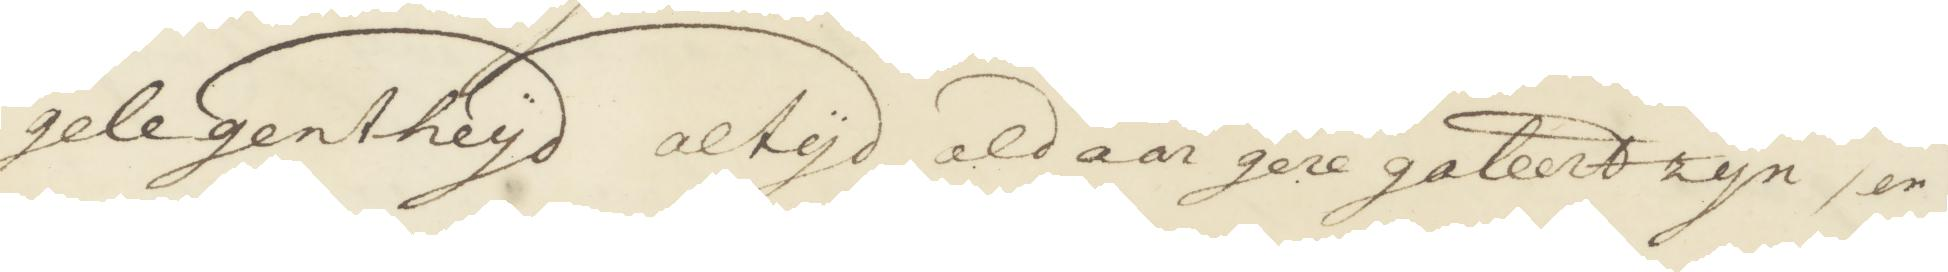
gelegentheijd altijd aldaar geregaleert zijn, en
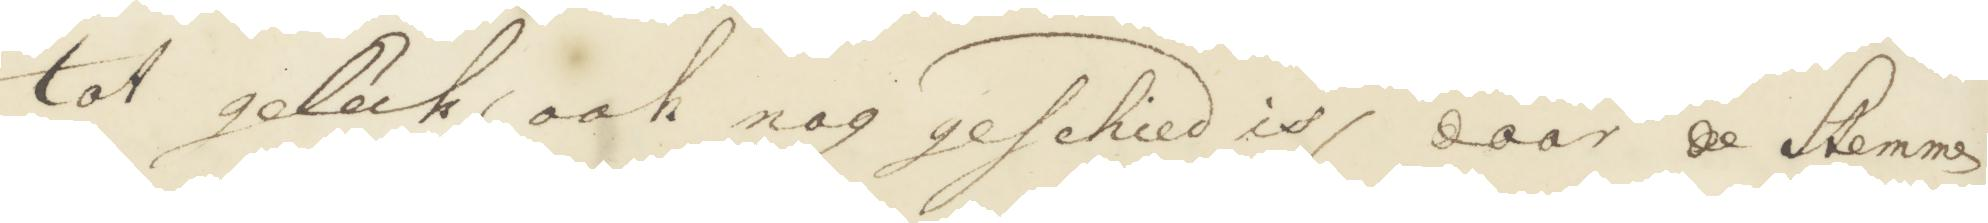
tot geluk ook nog geschied is, daar de stemmen
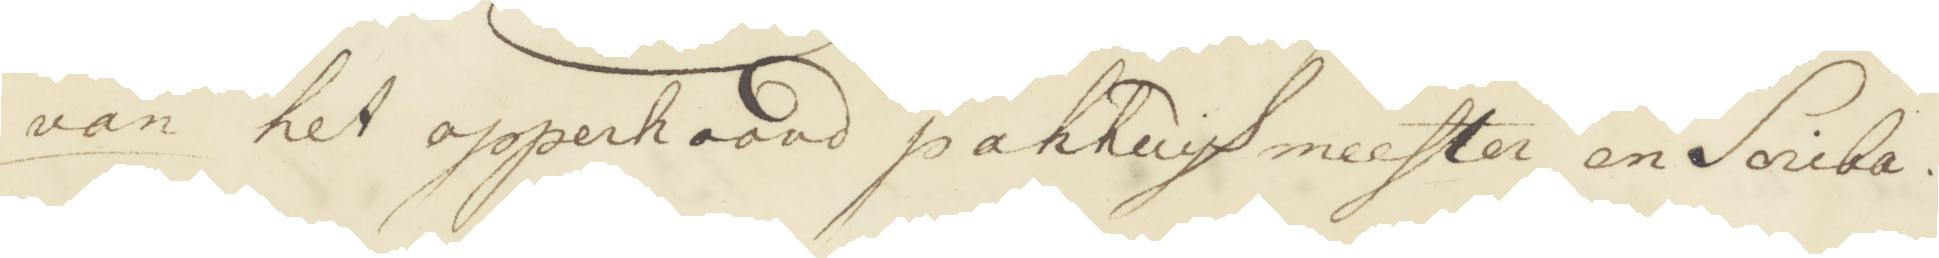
van het opperhoovd pakhuijs meester en scriba
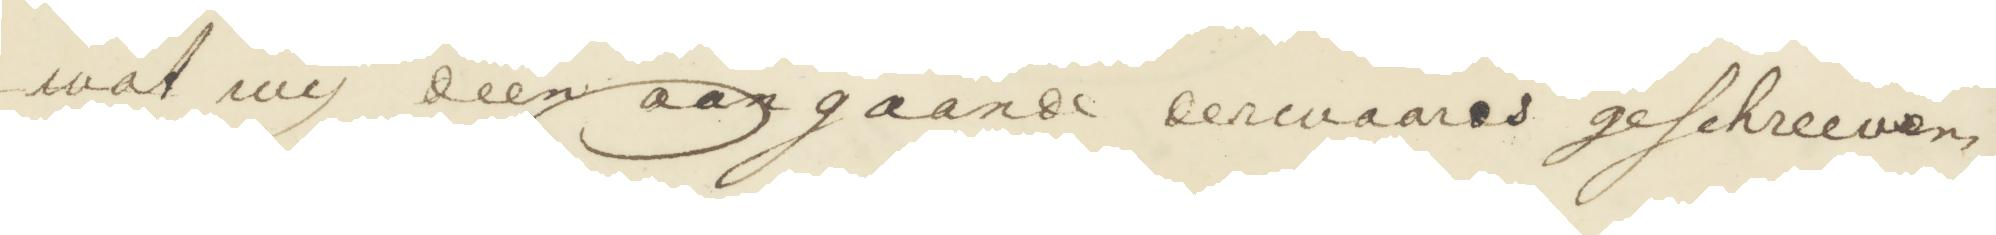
wat wij dien aangaande derwaards geschreeven
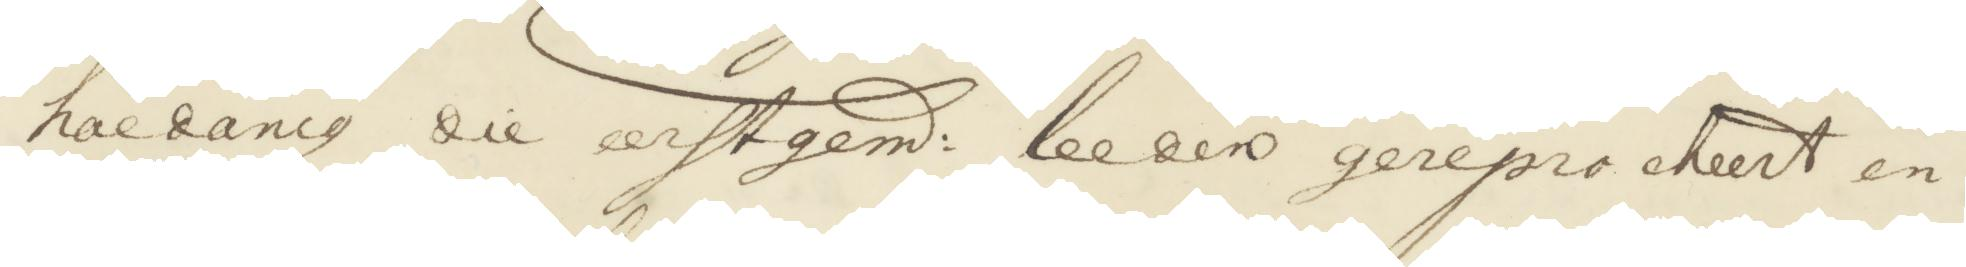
hoedanig die eerst gem: leeden gereprocheert en
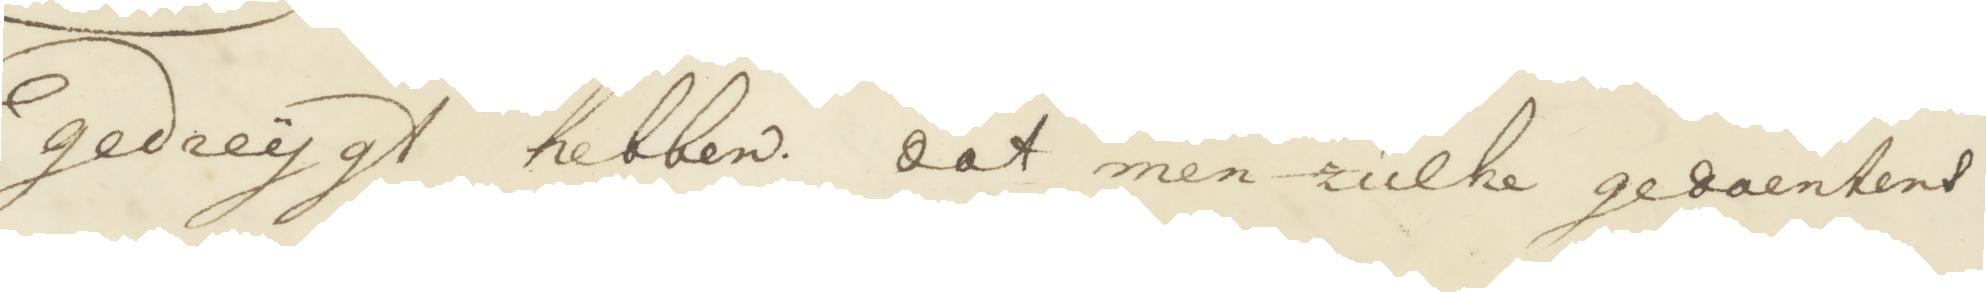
gedreijgt hebben. dat men zulke gedaentens
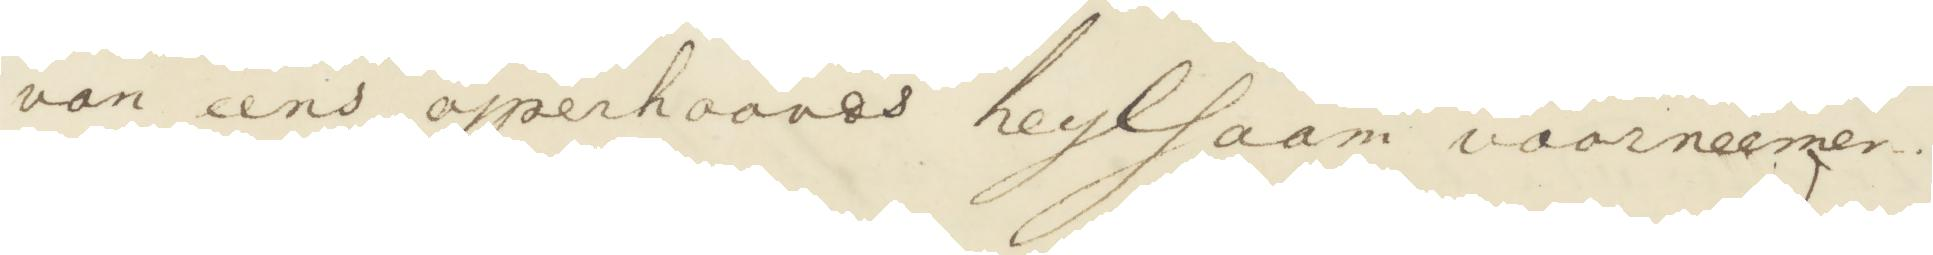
van eens opperhoovds heylsaam voorneemen
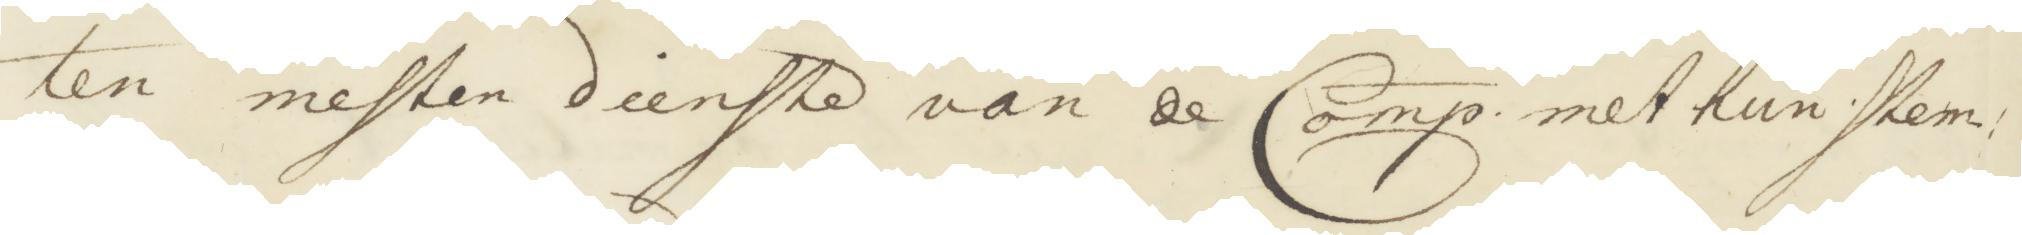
ten mesten dienste van de Comp. met hun stem„
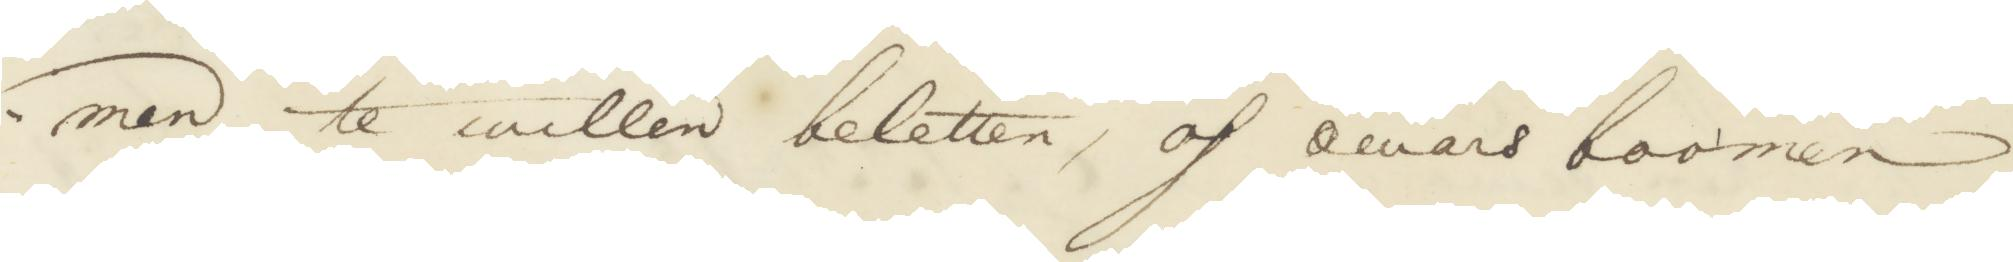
„men te willen beletten, of dwars boomen
